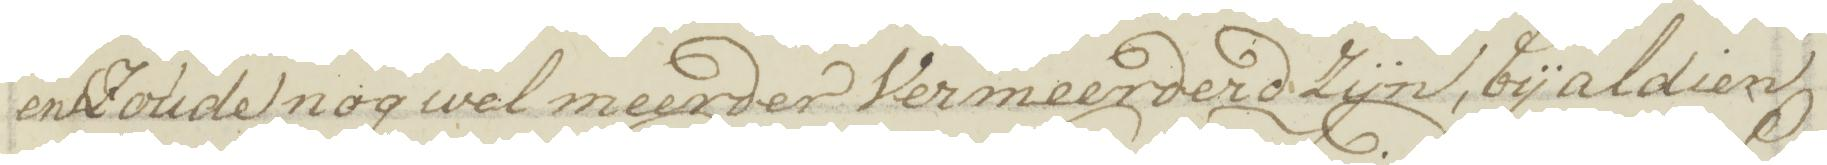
en zoude nog wel meerder vermeerderd zijn, bij aldien
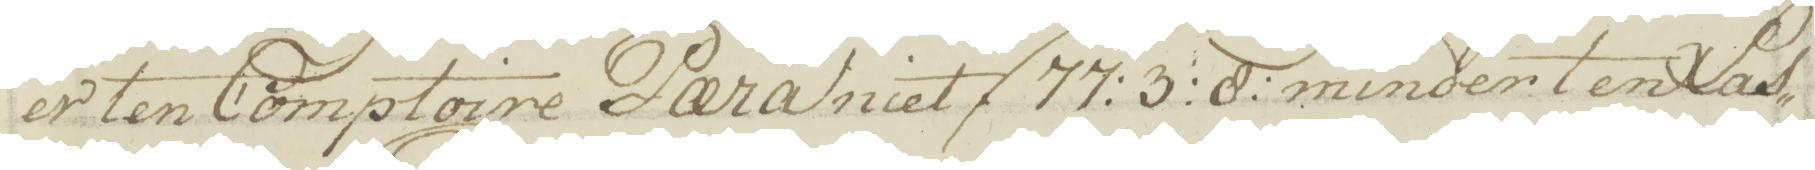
er ten Comptoire Poera niet ƒ77:3:8: minder ten Las„
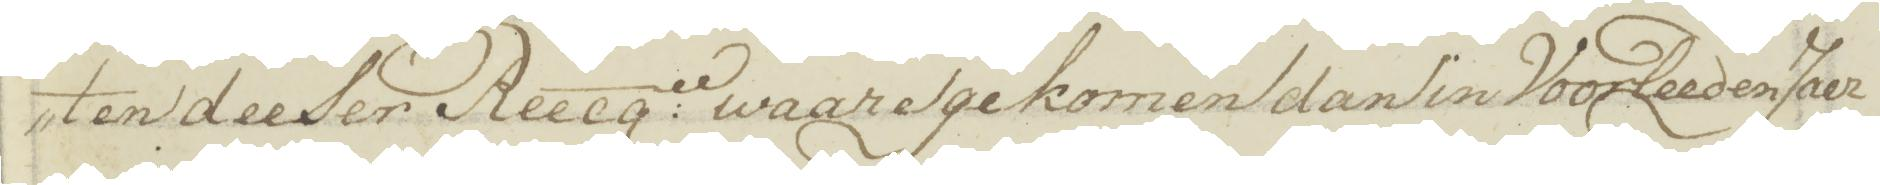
„ten deeser Reecq:ee waare gekomen dan in Voorleeden Jaer
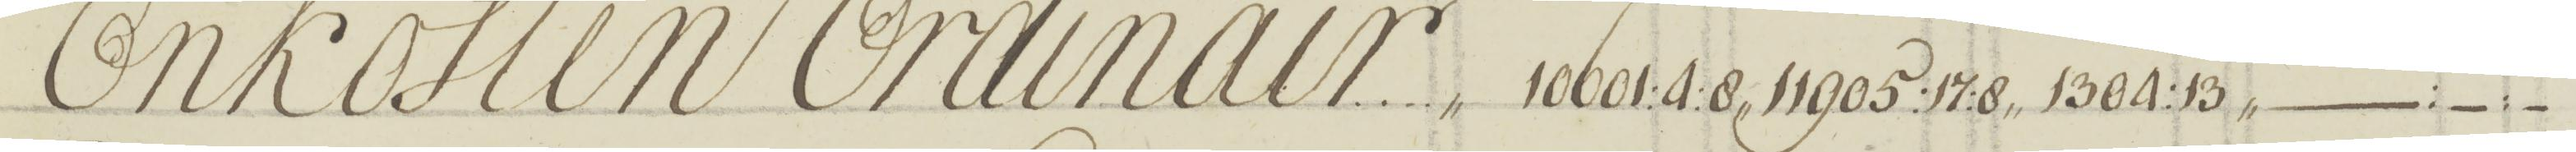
Onkosten Ordinair . . . . „ 10601:4:8„ 11905:17:8„ 1304:13„ —:—:—
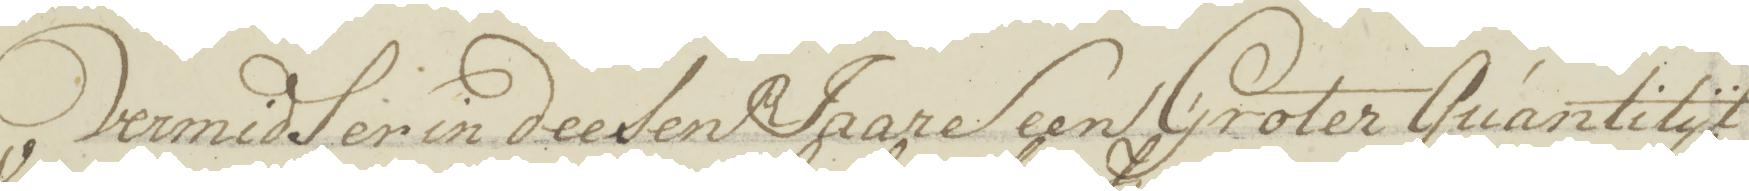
Vermids er in deesen Iaare een Groter Quantitijt
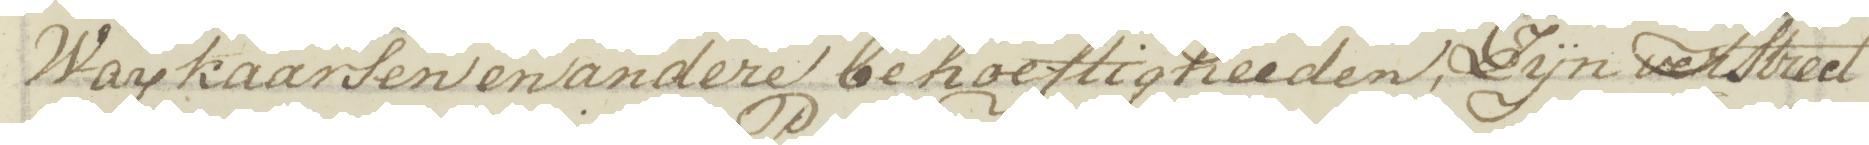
Waxkaarsen en andere behoeftigheeden, zijn verstrect
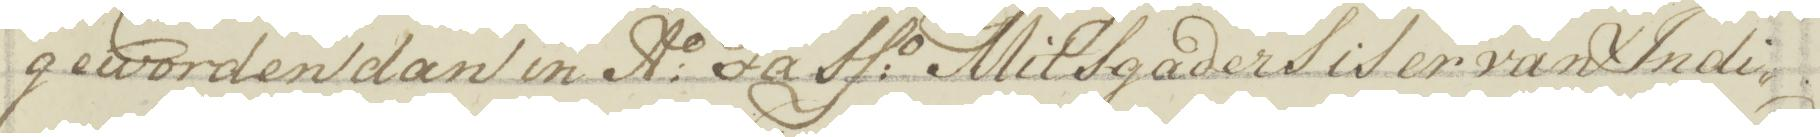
geworden dan in A:o Pass:o Mitsgaders is er van Indi„
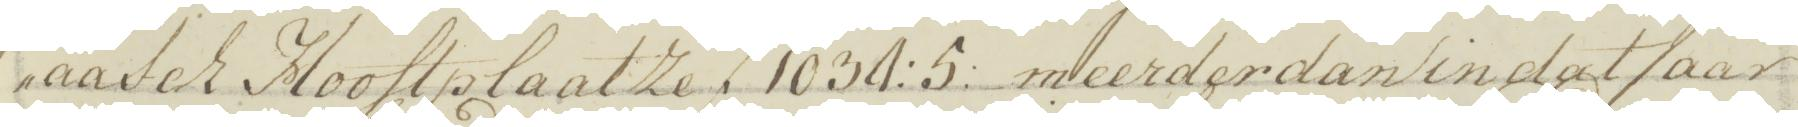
aasch Hooftplaatze ƒ1034:5: meerder dan in dat Jaar
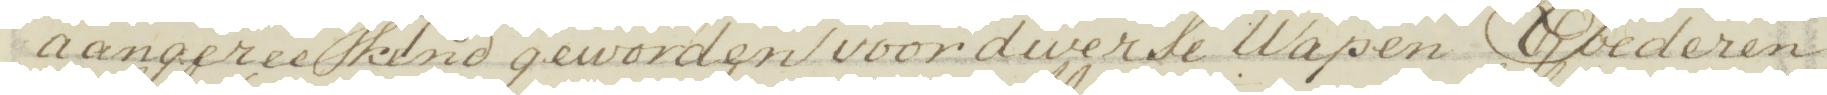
aangereekend geworden voor diverse Wapen Goederen
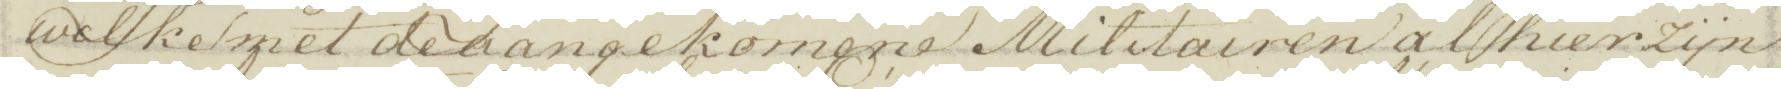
welke met de aangekomene Militairen alhier zijn
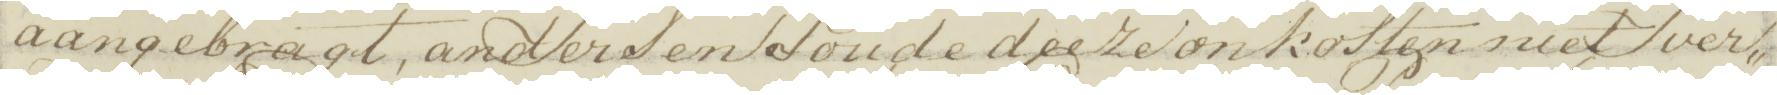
aangebragt, anders en soude deeze onkosten niet ver„
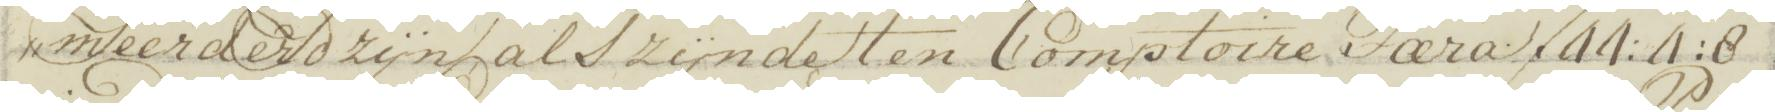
„meerderd zijn als zijnde ten Comptoire Poera ƒ44:4:8
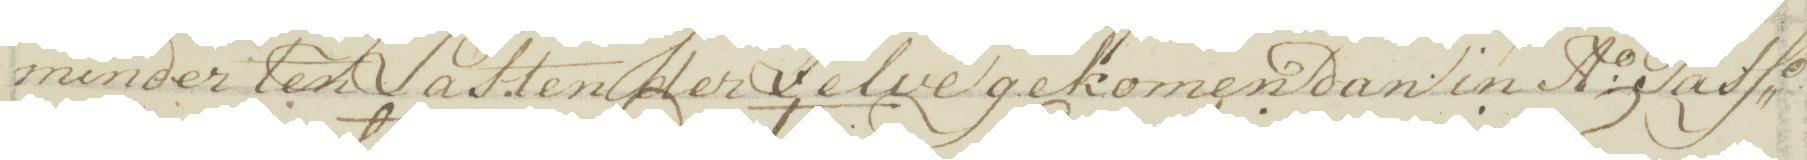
minder ten Lasten derzelve gekomen dan in A:o Pass„o
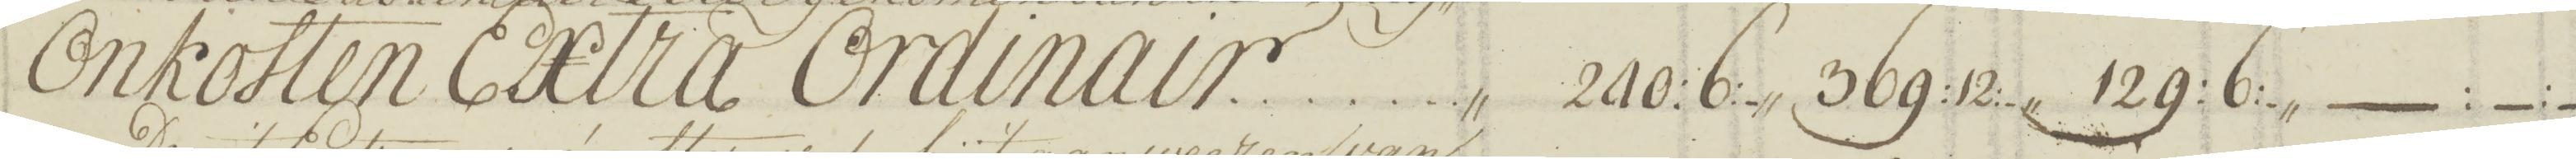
Onkosten Extra Ordinair. . . . . . . „ 240.6:-„ 369:12:_„ 129:6:-„ — : — : —
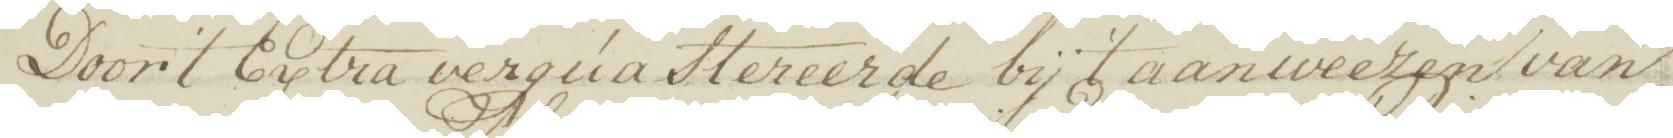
Door 't Extra verguastereerde bij 't aanweezen van
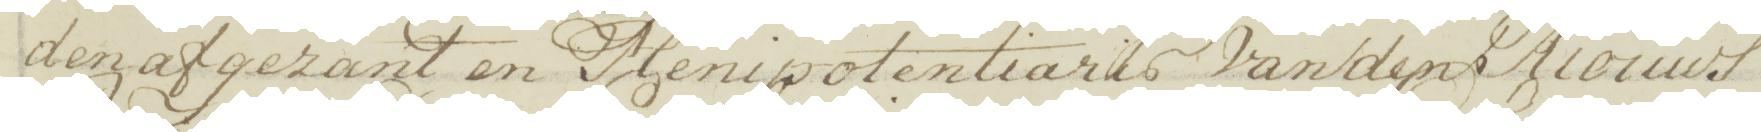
den afgezant en Plenipotentiaris van den Riouws
